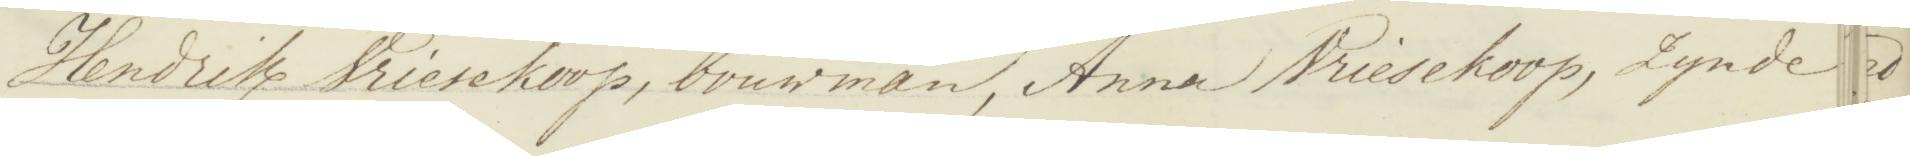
Hendrik Vriesekoop, bouwman, Anna Vriesekoop, zynde
